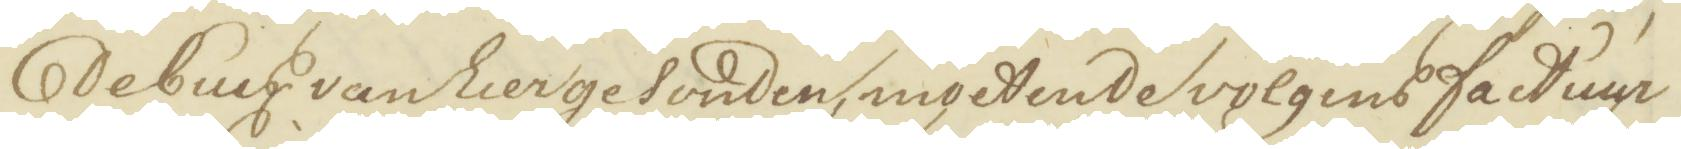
De buis van hier gesonden, moetende volgens factuur
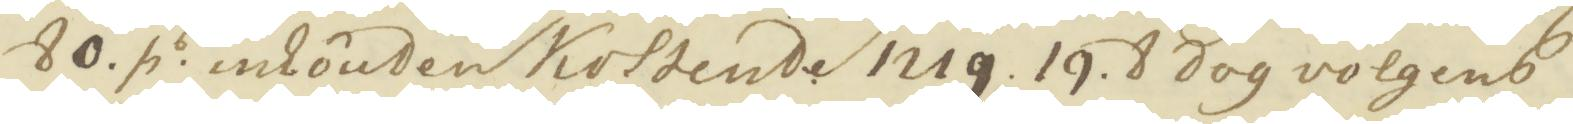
80. p.s inhouden Kostende 1219. 19. 8 dog volgens
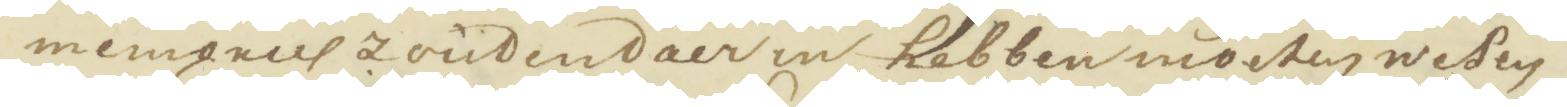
memorie zouden daerin hebben moeten wesen
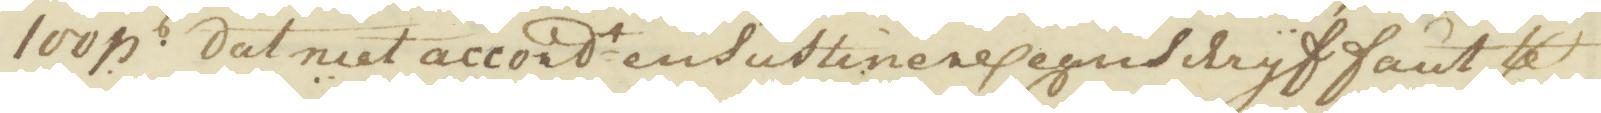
100 p:s dat niet accord=t en sustinere een schrijf faut te
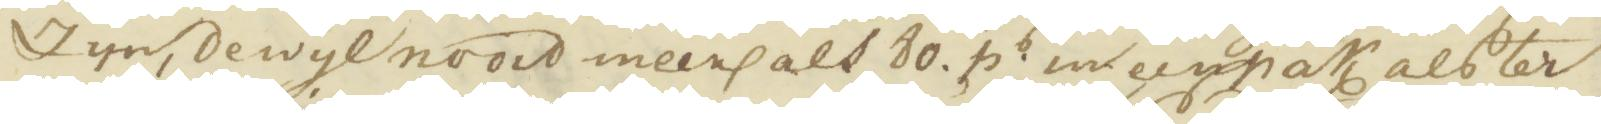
Zijn, dewijl nooid meer als 80. p:s in een pak als ter
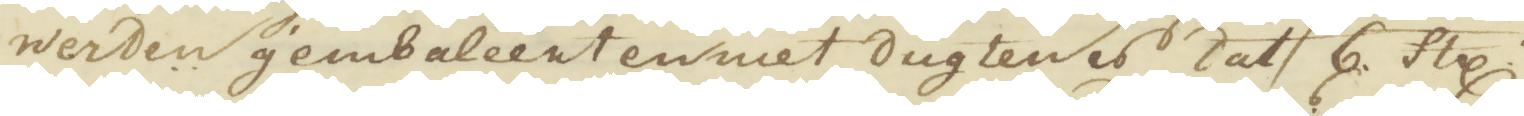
werden g'embaleert en niet dugten is dat 6. stx:
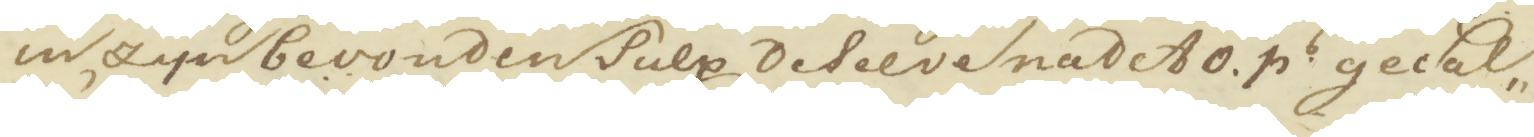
in zijn bevonden sulx deselve na de 80. p:s gecal„
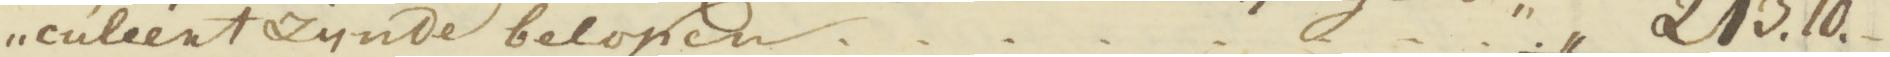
„culeert zijnde belopen. . . . . . . . . . „ 213.10. -
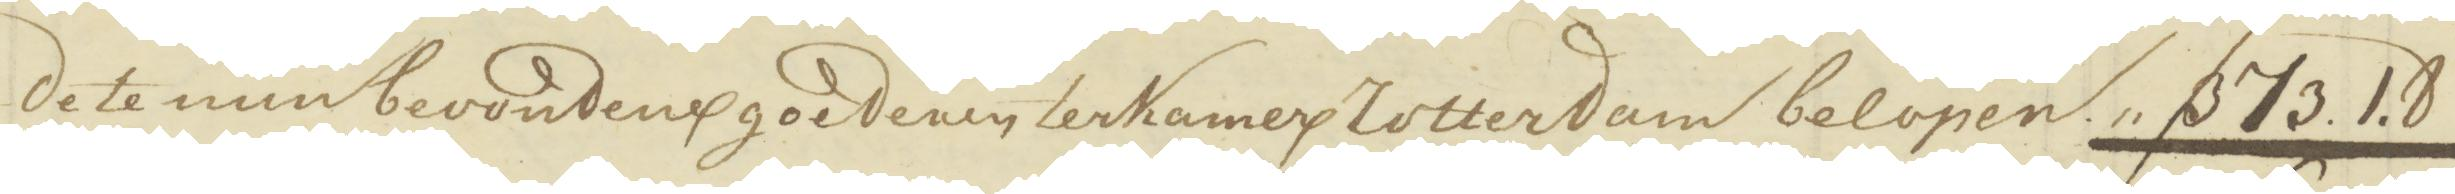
de te min bevonden goederen ter kamer Rotterdam belopen. „ 373. 1.8
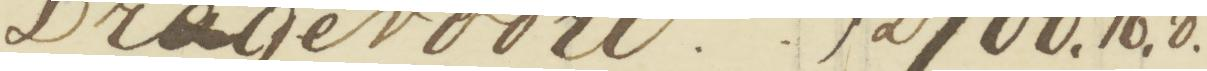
Dragevoort. . ƒ 2760.16.8.
